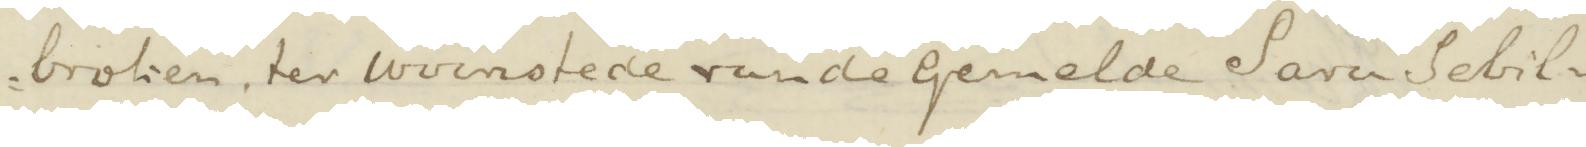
=broken, ter woonstede van de Gemelde Sara Sebil=
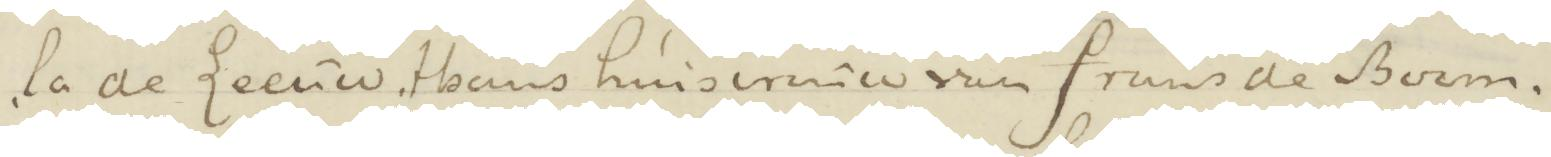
„la de Leeuw thans huisvrouw van Frans de Boom.
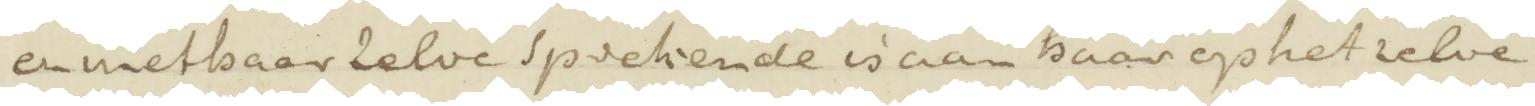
en met haar zelve sprekende is aan haar op het zelve
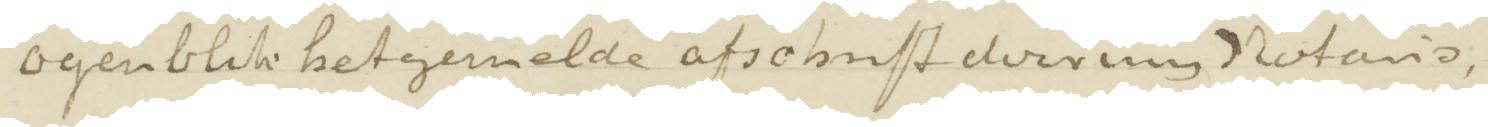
ogenblik het gemelde afschift door mij Notaris,
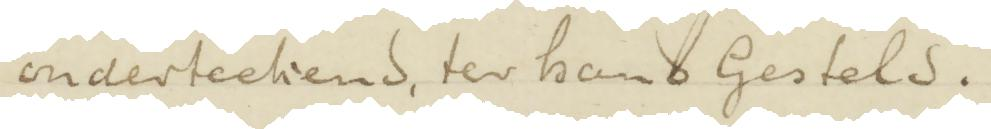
onderteekend, ter hand Gesteld.
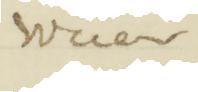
waar
